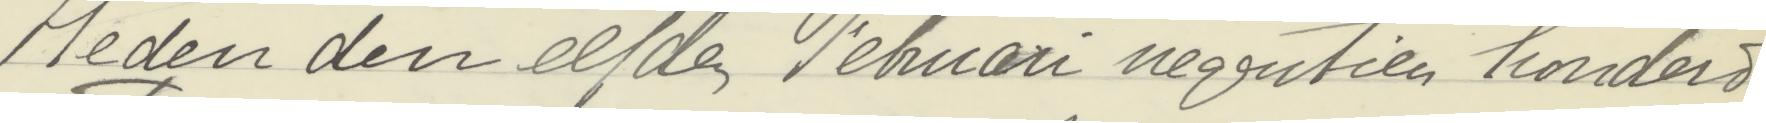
Heden den elfden Februari negentien honderd
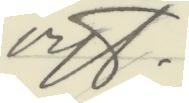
vijf.
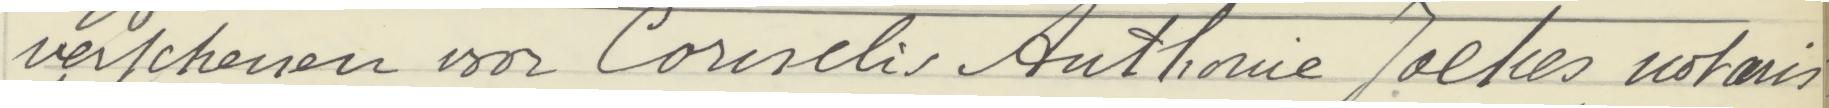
verschenen voor Connelis Anthonie Joekes, notaris
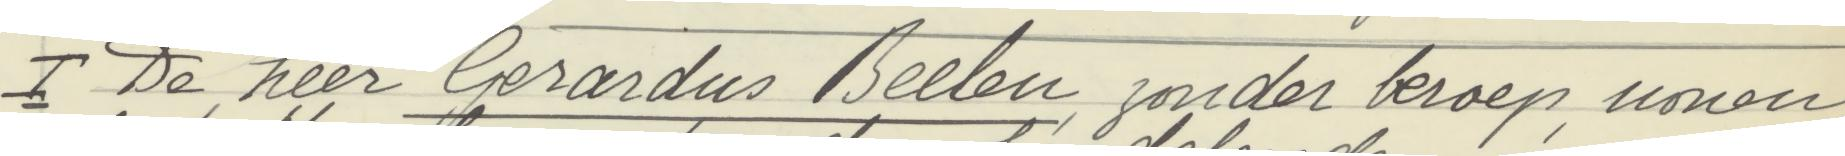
I De heer Gerardus Beelen, zonder beroep, wonen
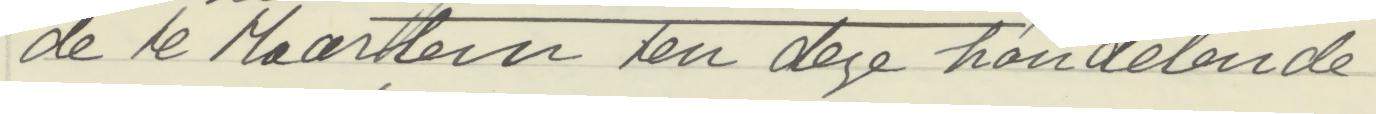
de te Haarlem ten deze handelende
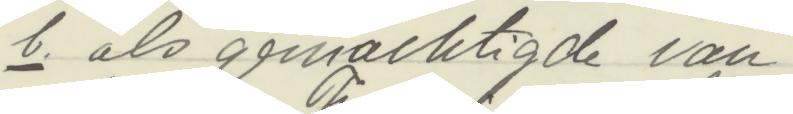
b. als gemachtigde van
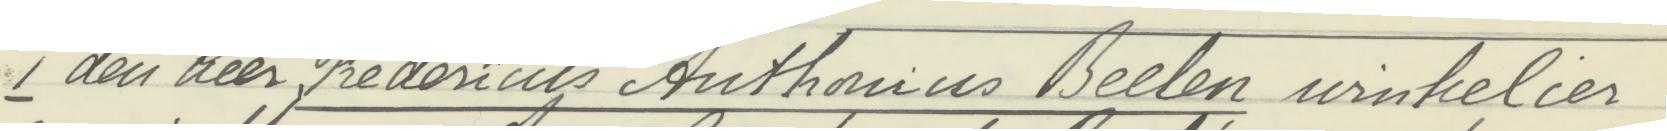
1 den Heer Federicus Anthonius Beelen, winkelier
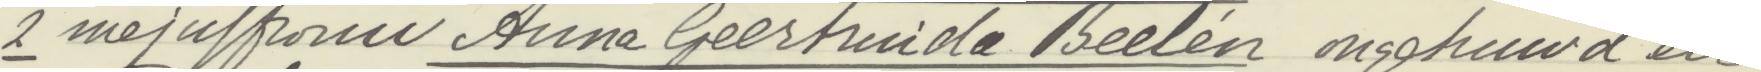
2 mejuffrouw Anne Geertruida Beelen, ongehuwd en
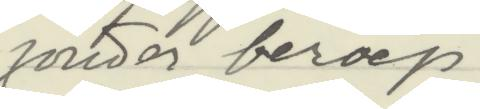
zonder beroep
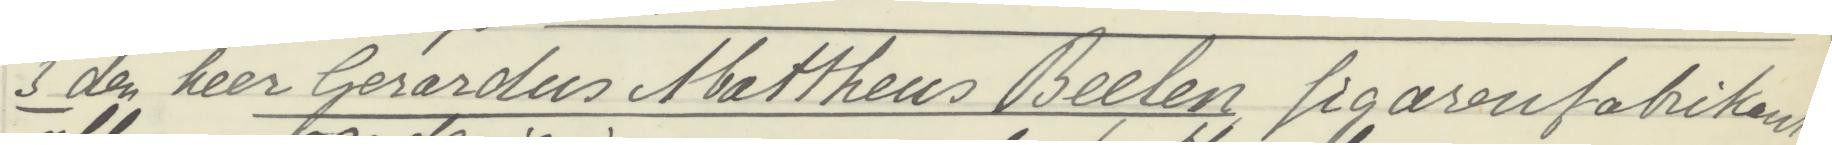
3 den heer Gerardus Mattheus Beelen, sigarenfabrikant
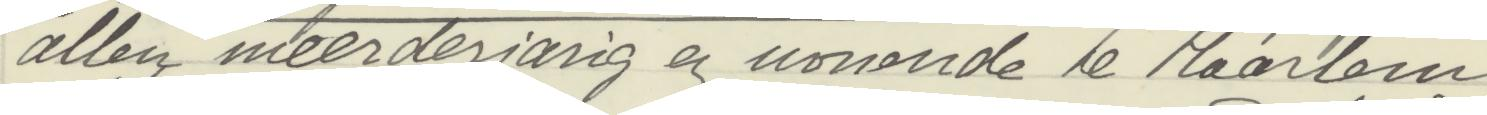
allen meerderjarig en wonende te Haarlem
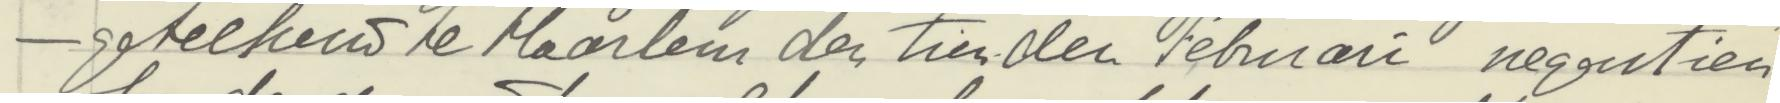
— geteekend te Haarlem den tienden Febuari negentien
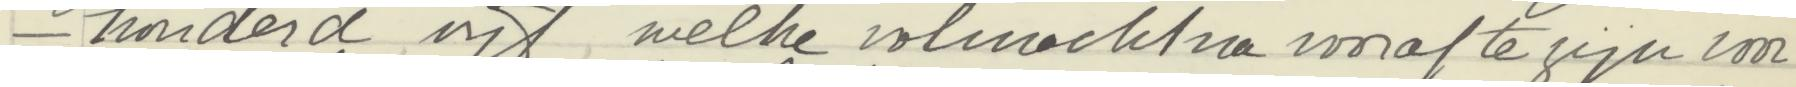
— honderd vijf welke volmacht na vooraf te zijn voor
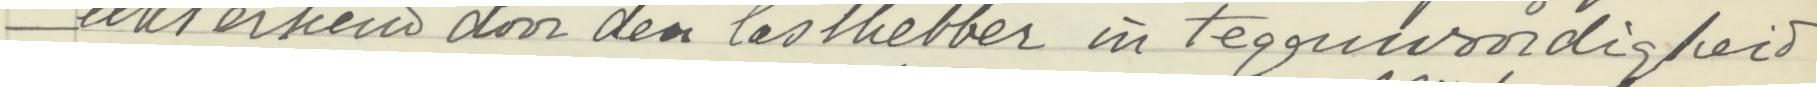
— echt erkend door den lasthebber in tegenwoordigheid
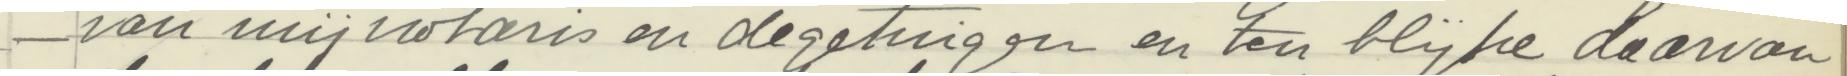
— van mij notaris en de getuigen en ten blijke daarvan
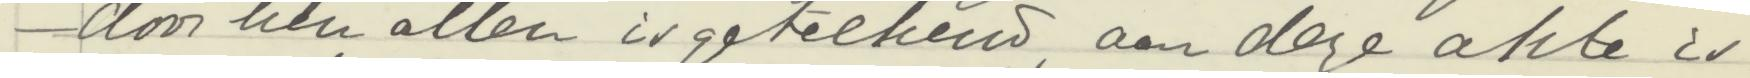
— door hen allen is geteekend, aan deze akte is
